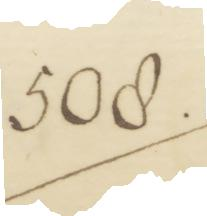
508.
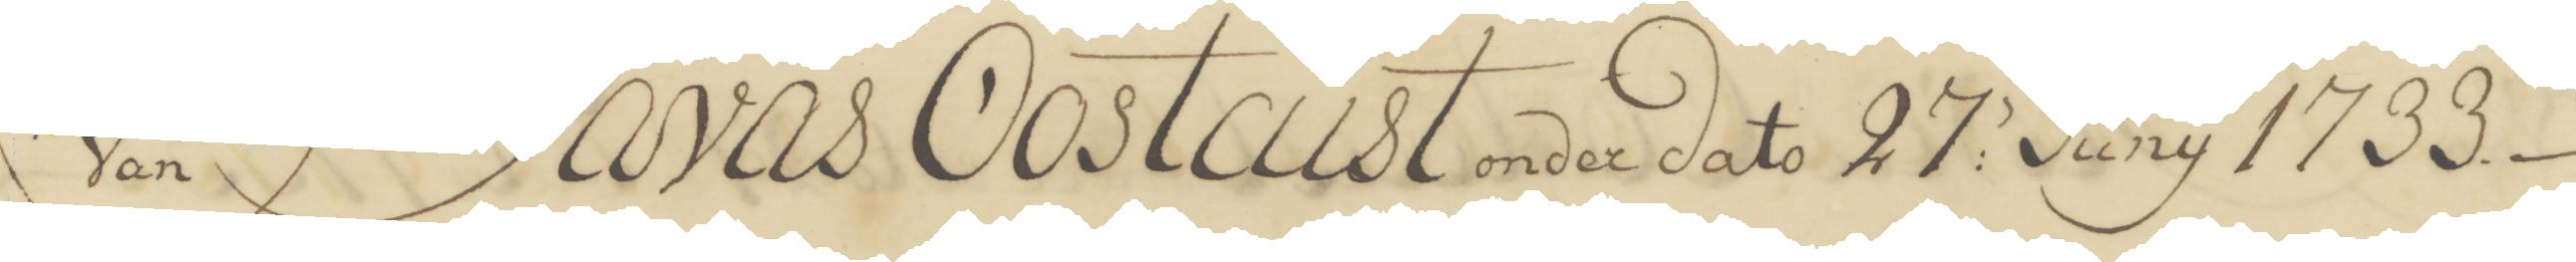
Van Javas Oostcust onder dato 27:' Iunij 1733. —
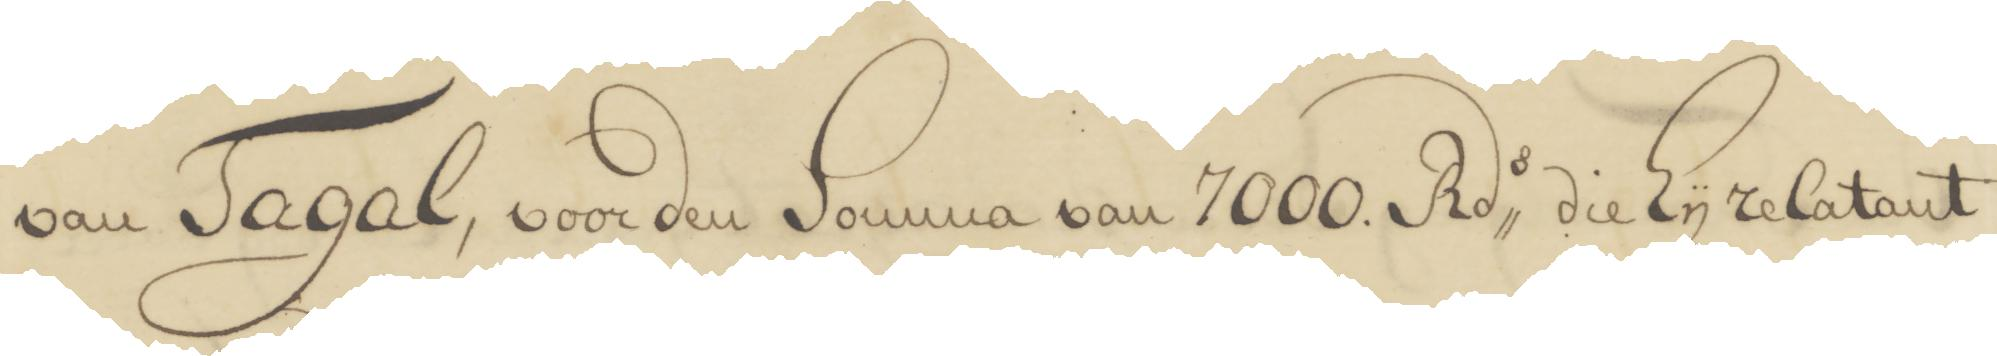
van Tagal, voor den Somma van 7000. Rd„s die hij relatant
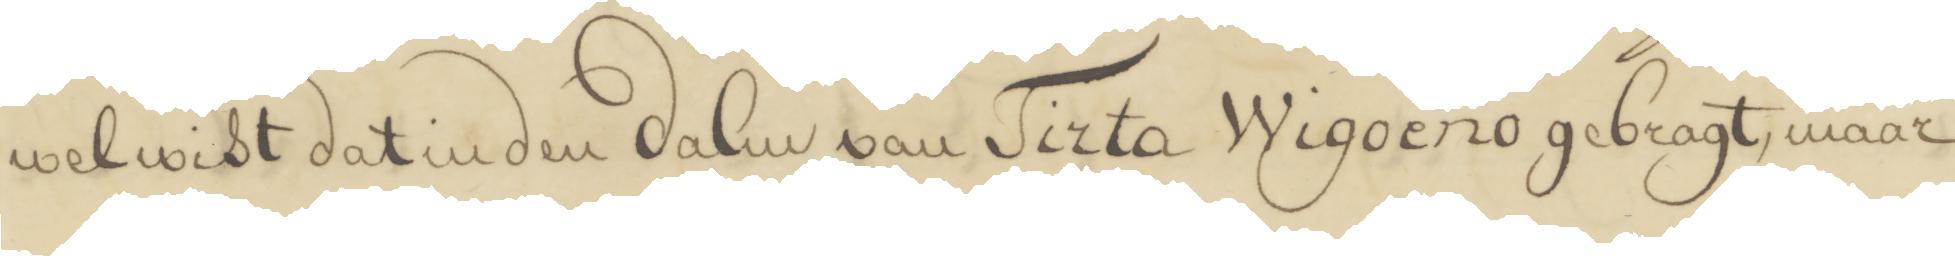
wel wist dat in den dalm van Tirta Wigoeno gebragt, maar
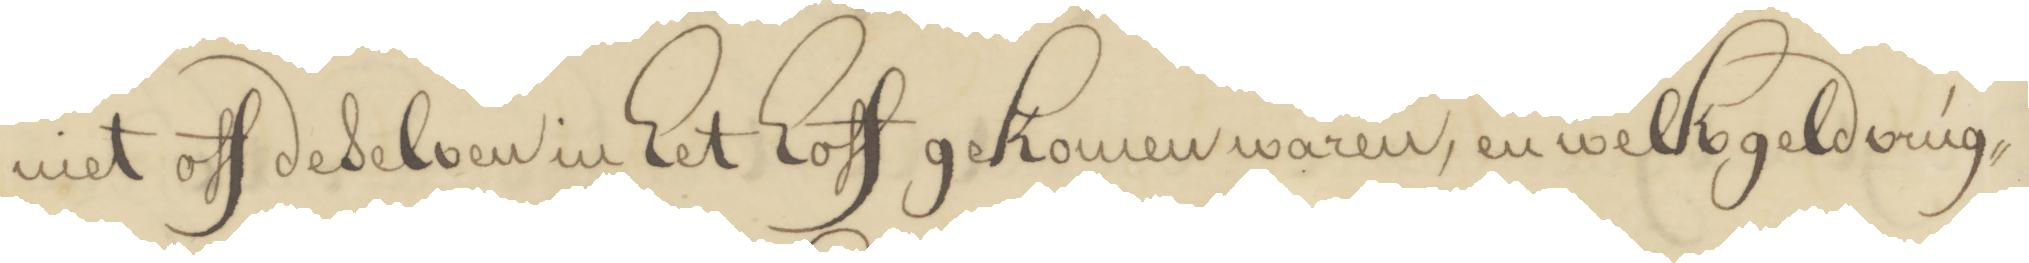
niet off deselven in het hoff gekomen waren, en welk geld vrug„
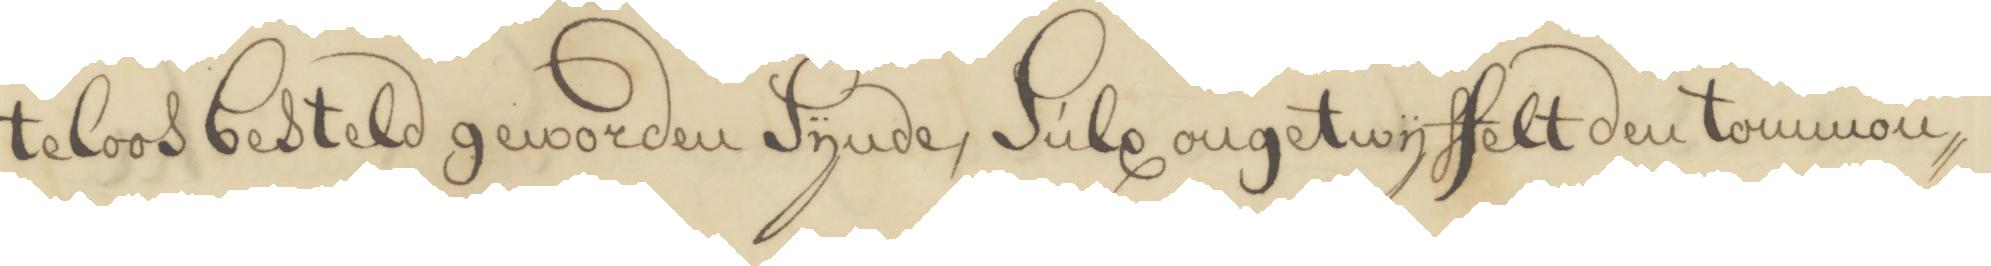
teloos besteld geworden sijnde, sulx ongetwijffelt den tommon„
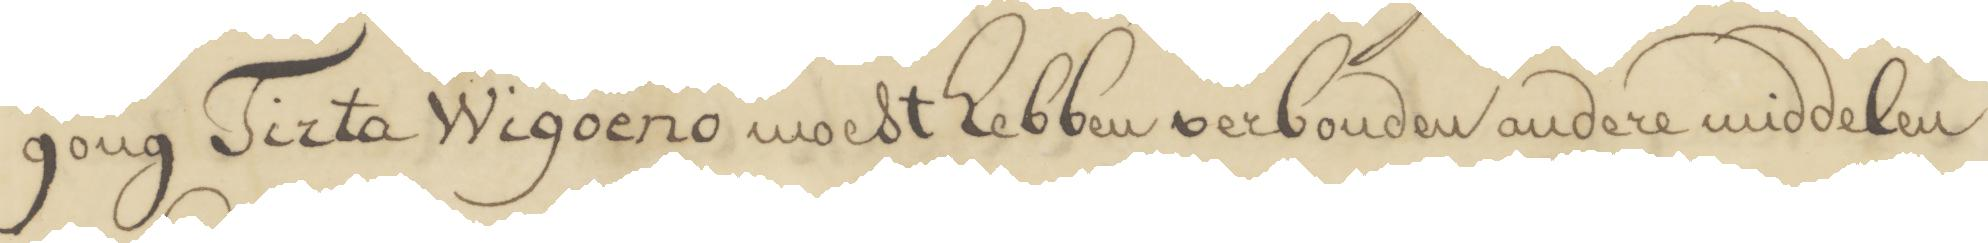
gong Tirta Wigoeno moest hebben verbonden andere middelen
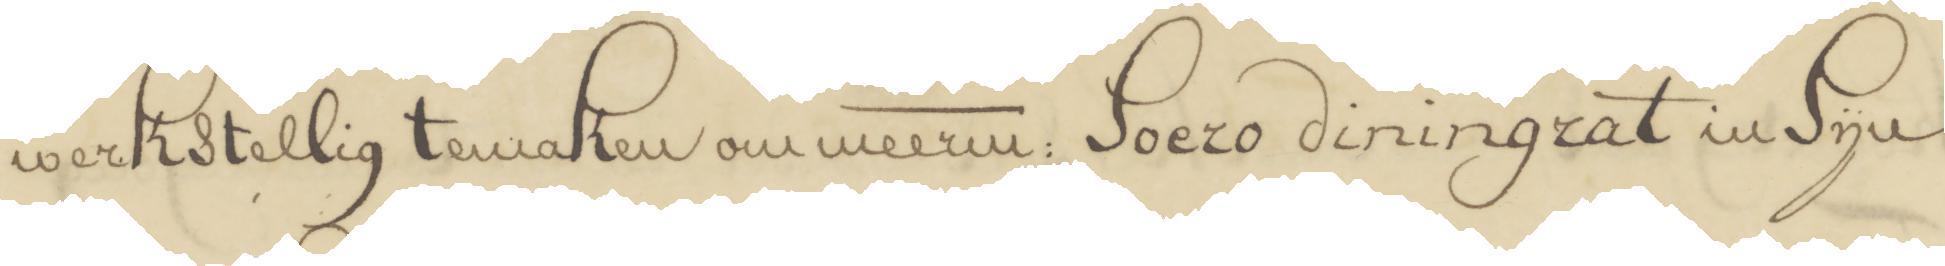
werkstellig temaken om meerm: soero diningrat in sijn
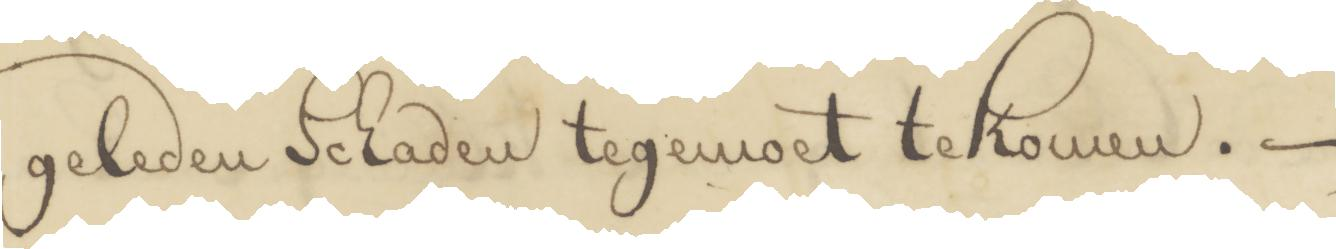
geleden schaden tegemoet te komen. —
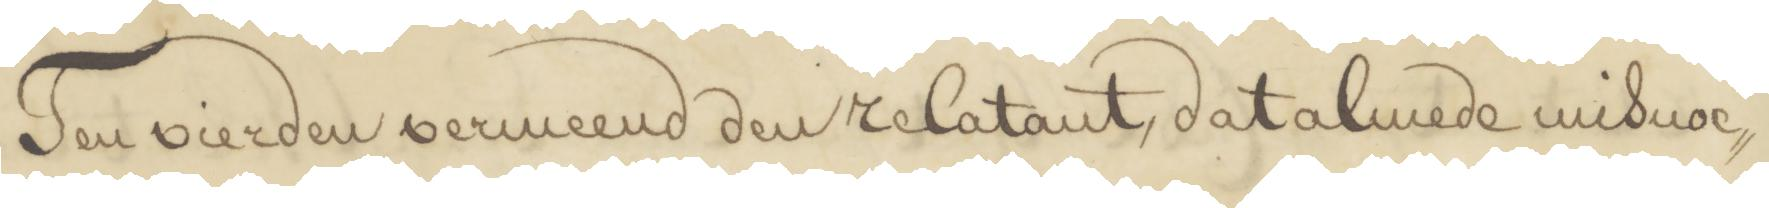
Ten vierden vermeend den relatant, dat almede misnoe„
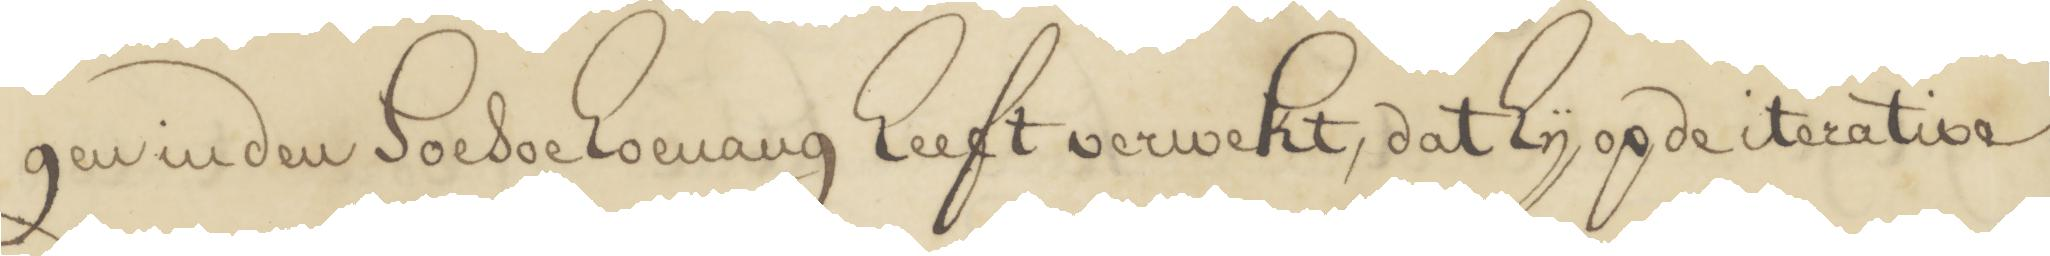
gen in den soesoehoenang heeft verwekt, dat hij op de iterative
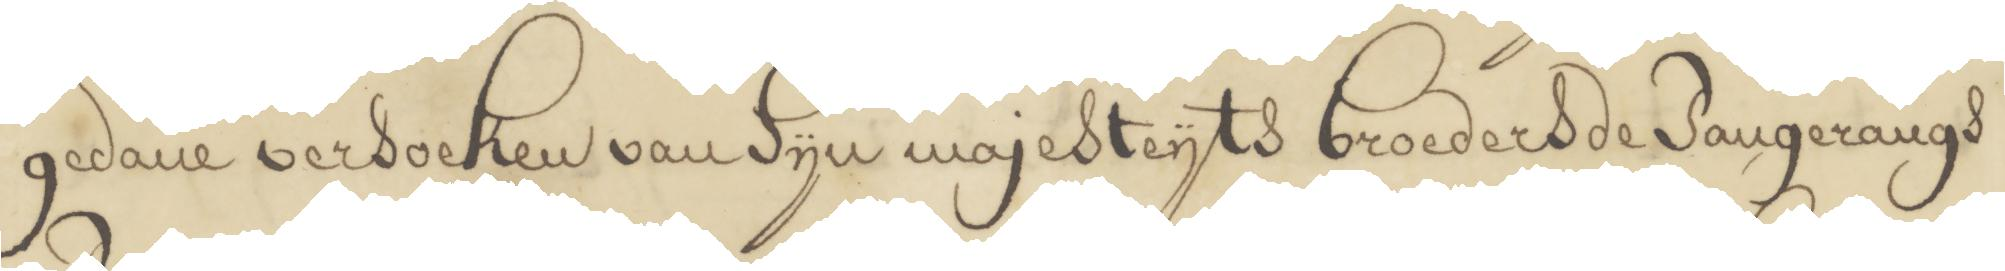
gedane versoeken van sijn majesteijts broeders de Pangerangs
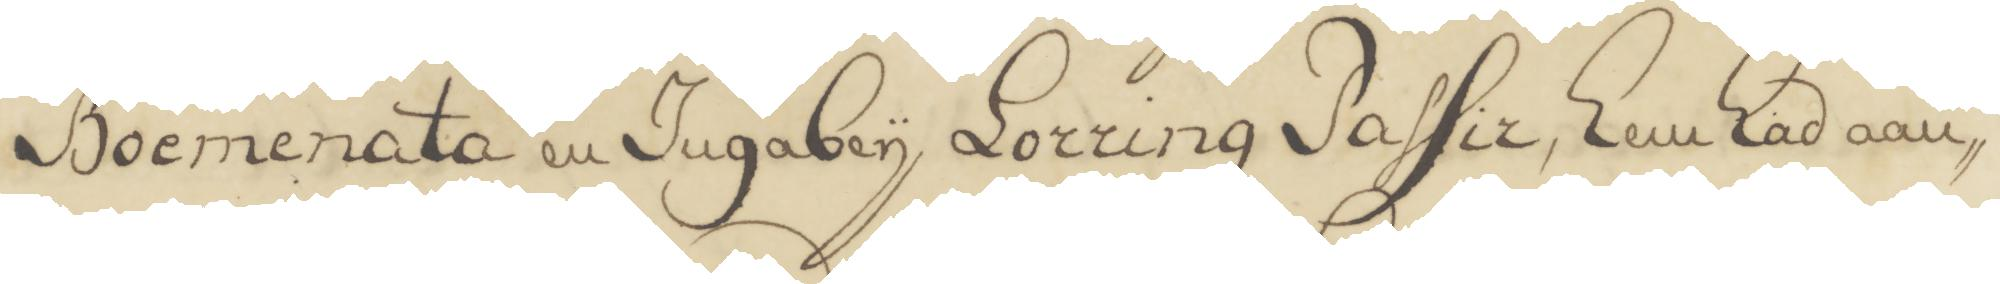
Boemenata en Ingabeij Lorring Passir, hem had aan„
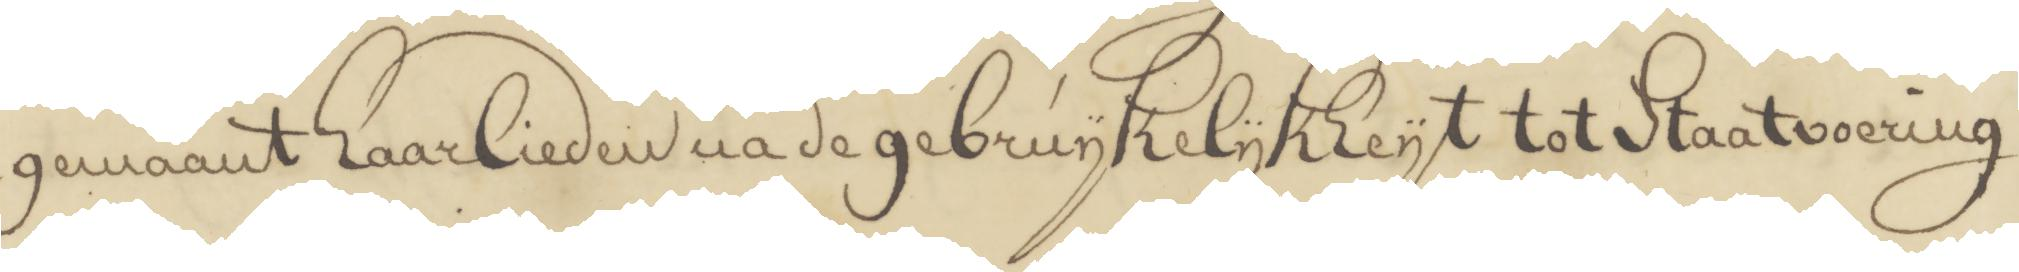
gemaant haarlieden na de gebruijkelijkheijt tot staatvoering
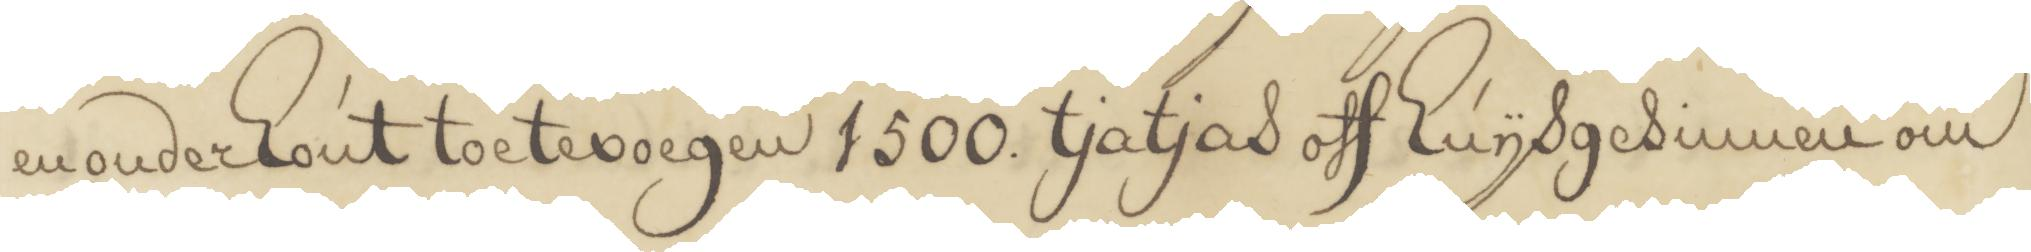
en onderhout toe tevoegen 1500. tjatjas off huijsgesinnen om
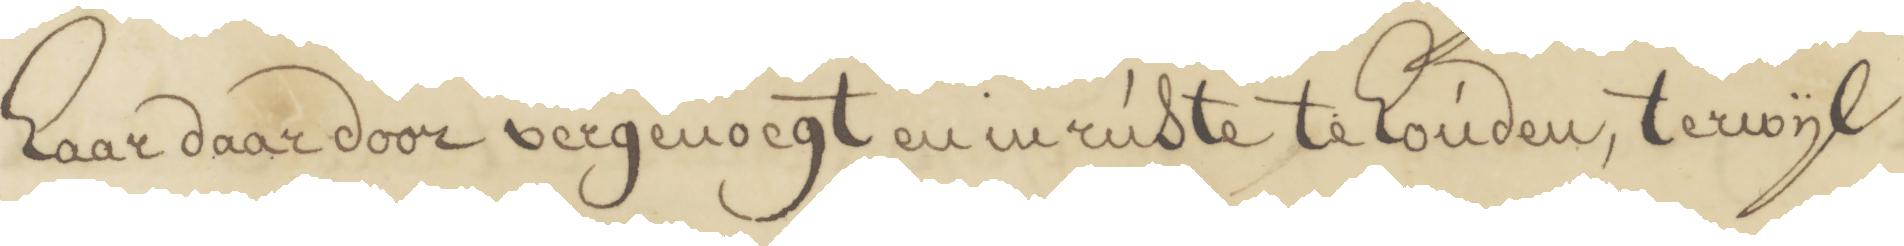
haar daar door vergenoegt en in ruste te houden, terwijl
